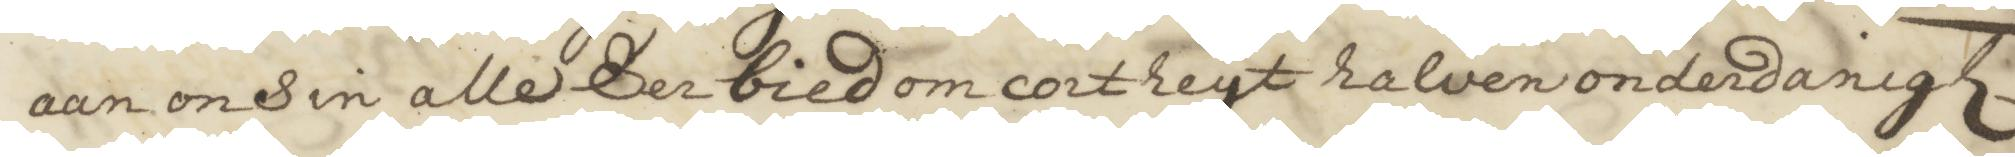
aan ons in alle Eerbied om cortheijt halven onderdanigh
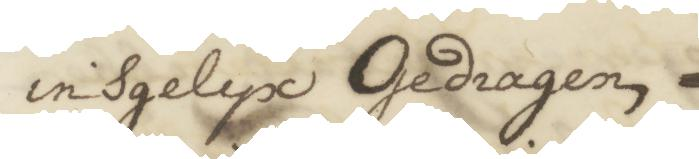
insgelijx Gedragen, _
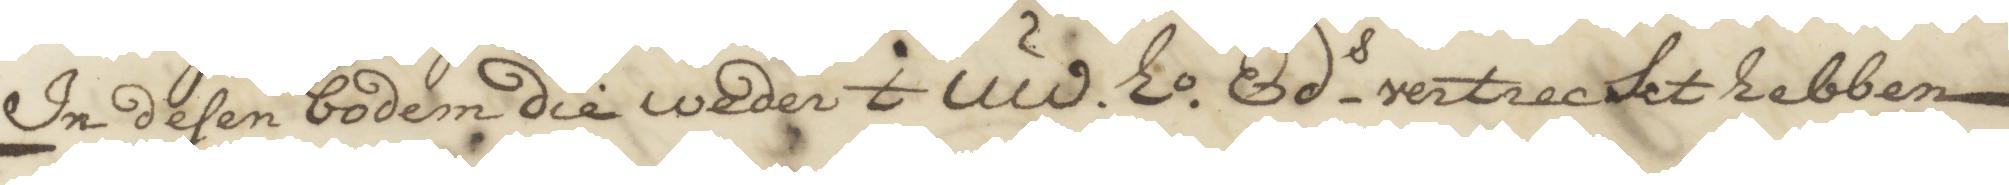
In desen bodem die weder ’t uw. h.o Ed_s vertreckt hebben
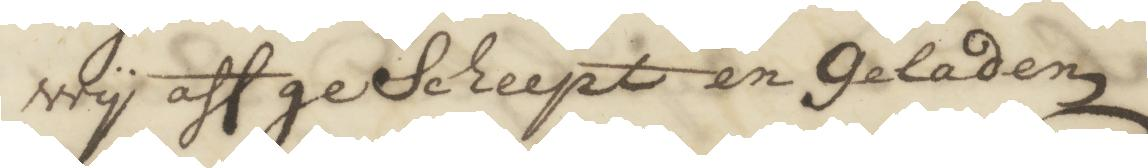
wij affgescheept en Geladen
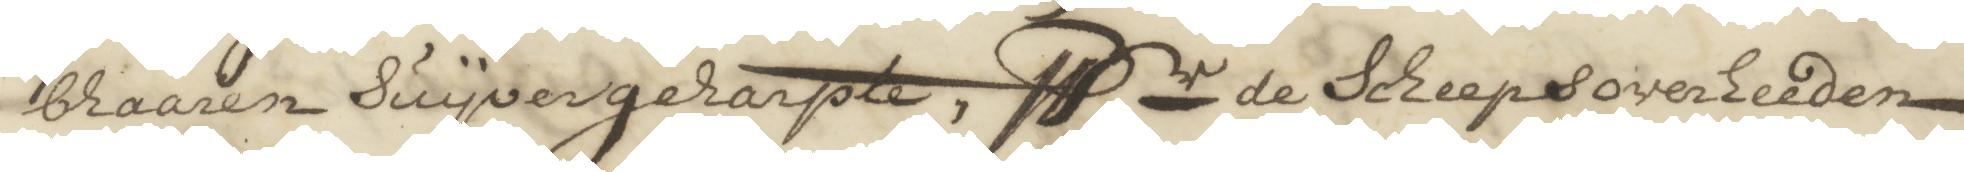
bhaaren suijver geharpte, PP,-r de scheepsoverheeden
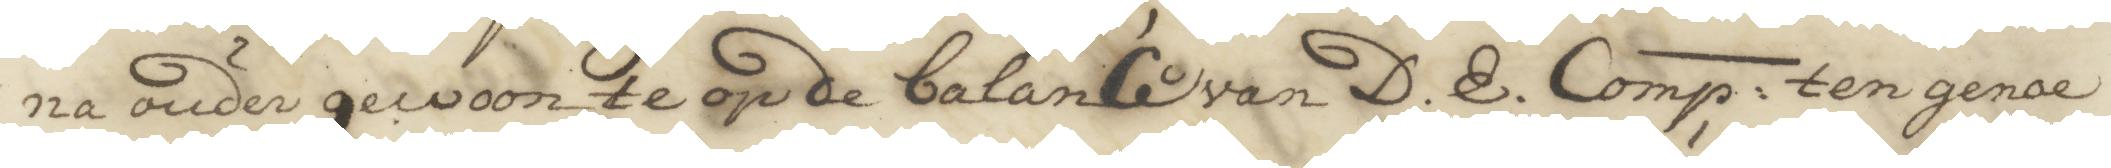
na ouder gewoon te op de balanCe' van D. E. Comp: ten genoe
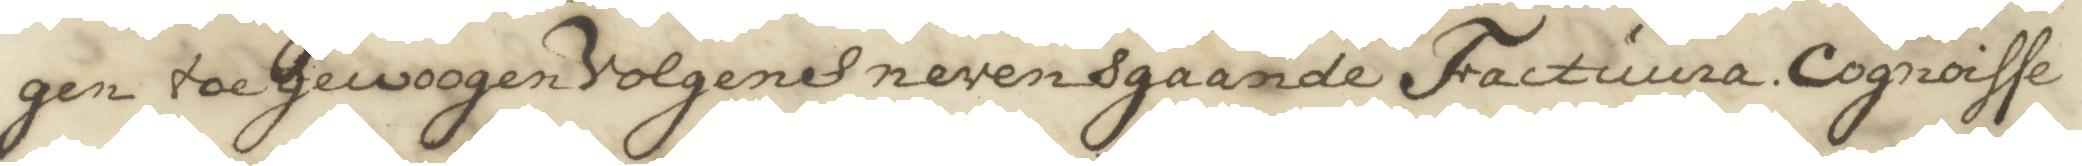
gen toegewoogen volgens nevensgaande Factuura. Cognoisse
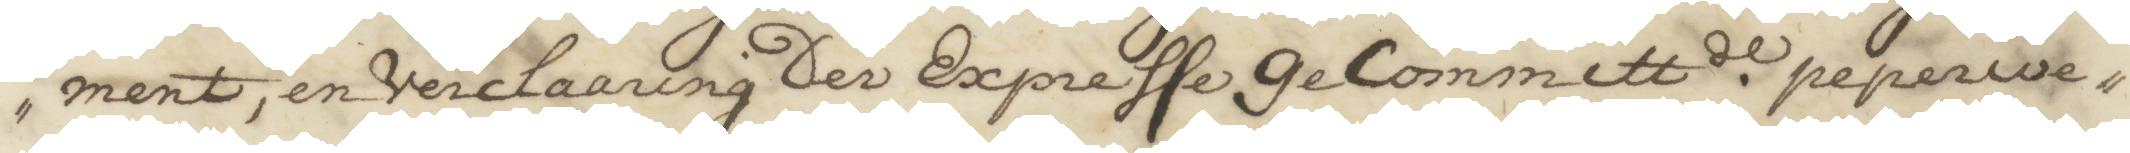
„ ment, en verclaaring der Expresse geCommitt.de peperwe„
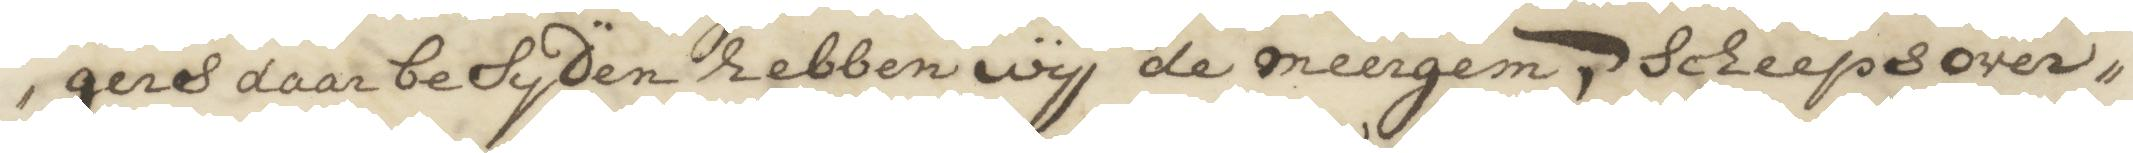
„ gers daar besijden hebben wij de meergem,' scheepsover„
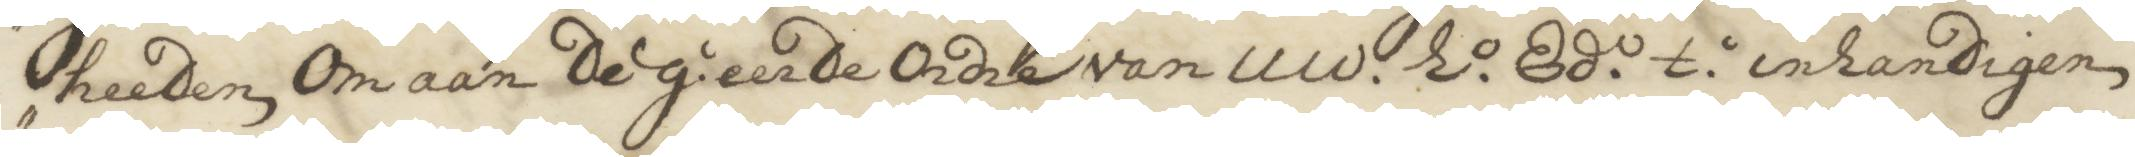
heeden om aan de g'eerde ordre van uw. h.o Ed.e t.' inhandigen
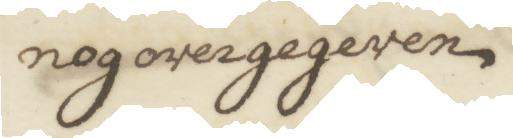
nog overgegeven
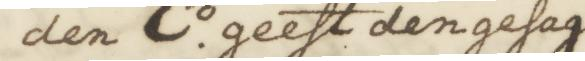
den C.o geeft den gesag
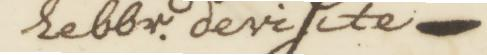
hebbr. devisite—
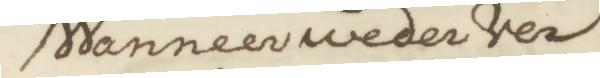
Wanneer weder ver
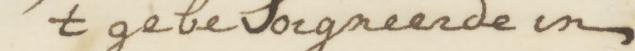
’t gebesoigneerde in
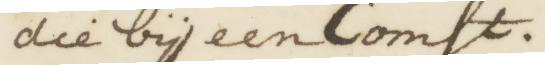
die bij eenComst.
